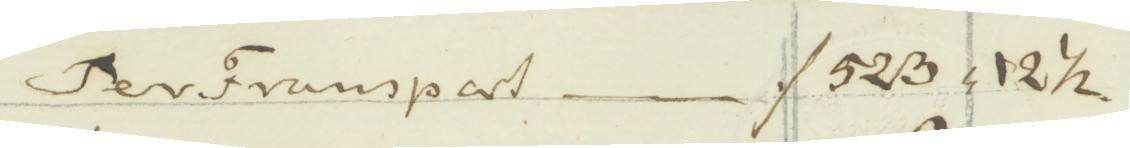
Per Transport - - - f 523 „12½.
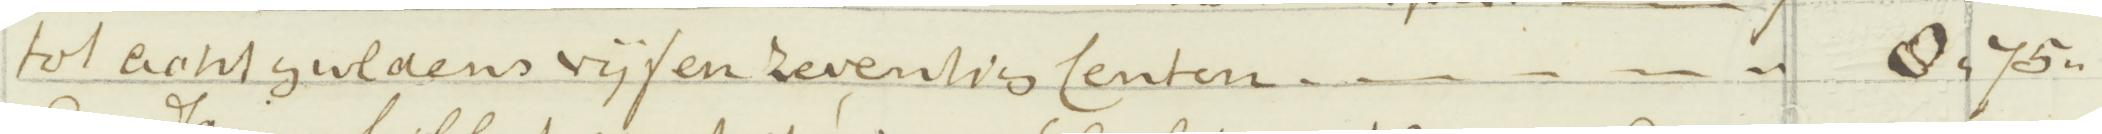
tot acht guldens vijfen zeventig Centen - - - - - - -„ 8 „ 75 „
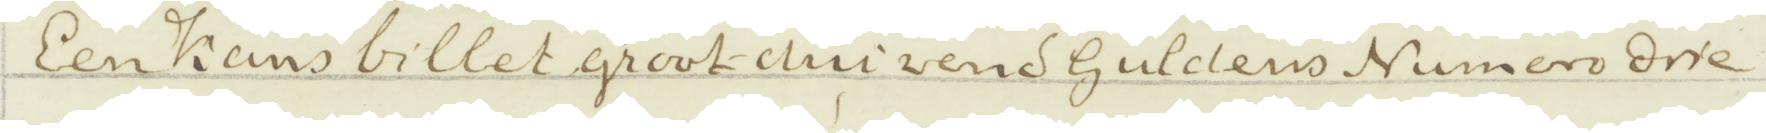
Een Kans billet groot duizend Guldens Numero drie
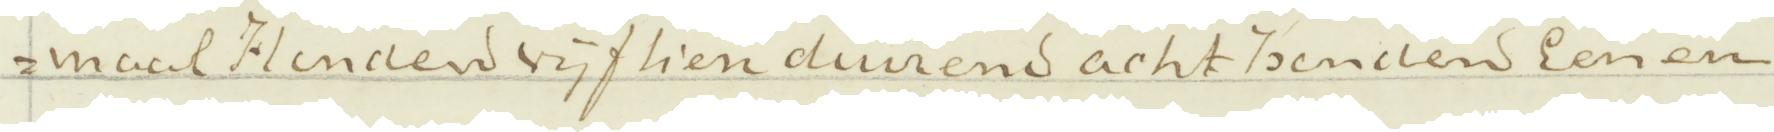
=maal Honderd vijftien duizend acht honderd Een en
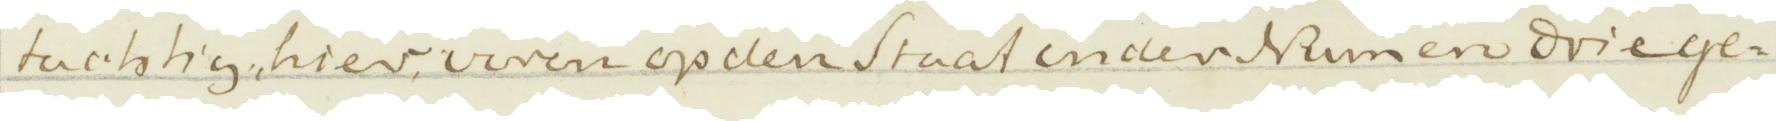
tachtig, hier, voren op den staat onder Numero drie ge„
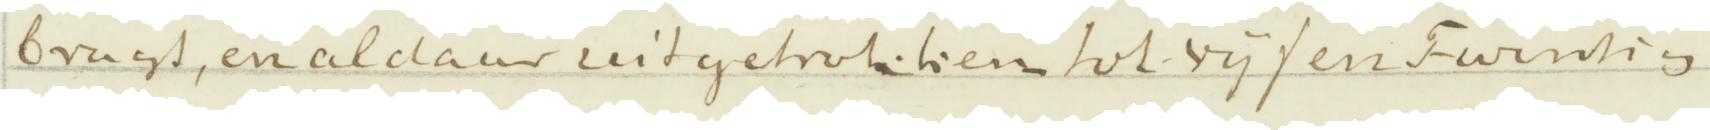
bragt, en aldaar uitgetrokken tot vijfen Twintig
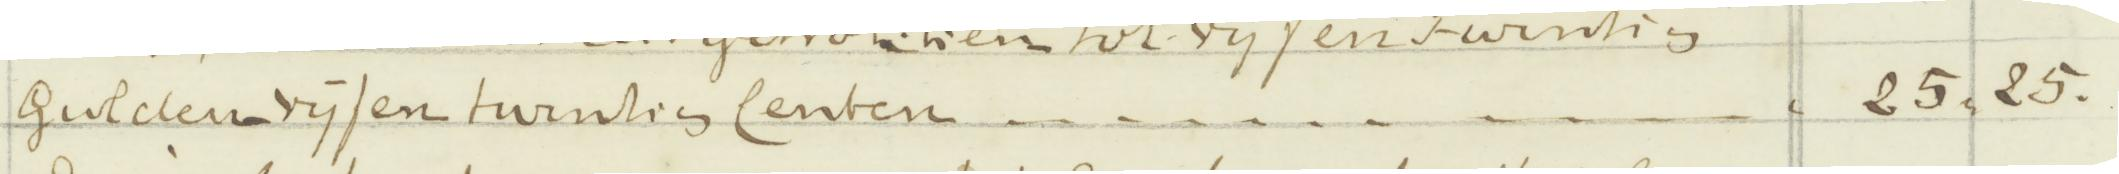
Gulden vijfen twintig Centen - - - - - - - - - - - - „ 25 „ 25.
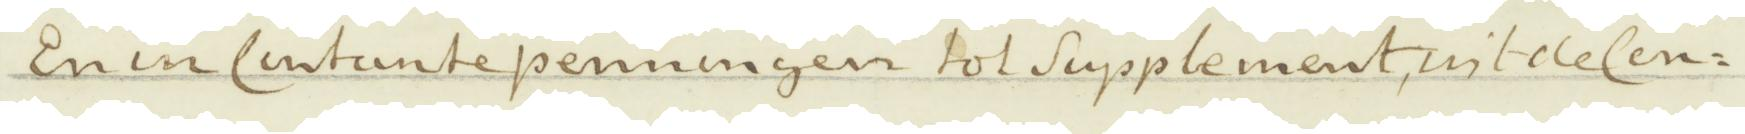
En in Contante penningen tot Supplement uit de Con=
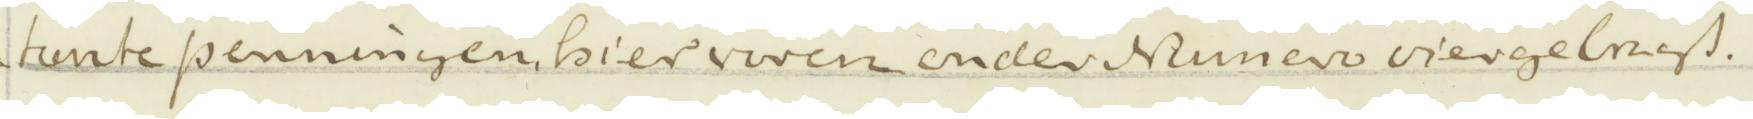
=tante penningen hier voren onder nummero vier gebragt.
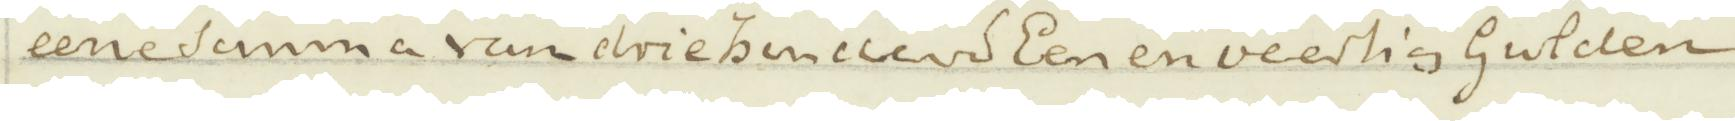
eene somma van drie honderd Een en veertig Gulden
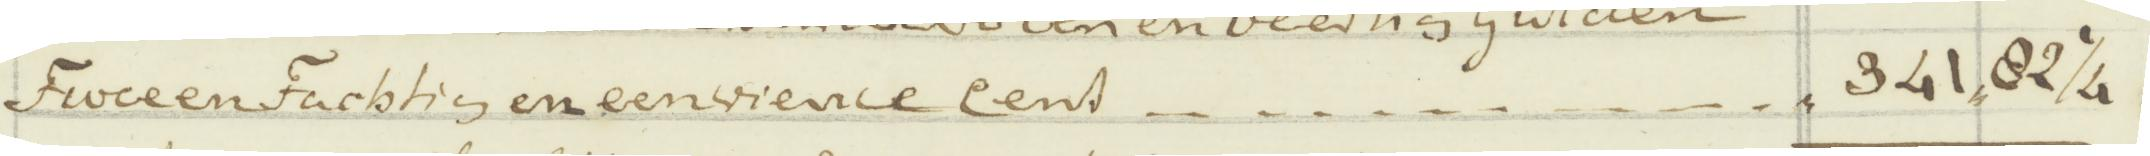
Twee en Tachtig en een vierde Cent - - - - - - - - - - - „341 „ 82¼
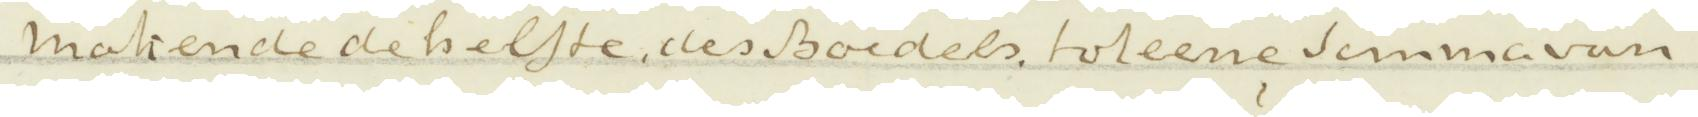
makende de helfte, des Boedels tot eene somma van
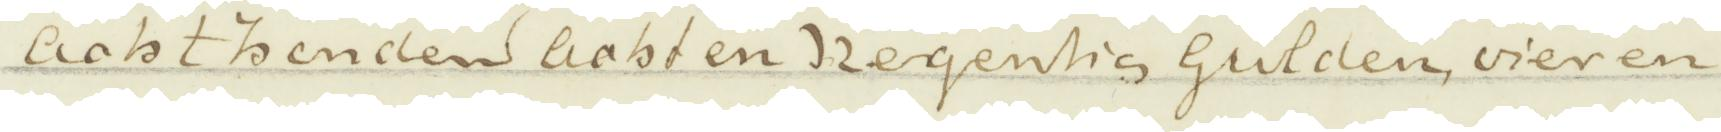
Acht Honderd achten Negentig gulden vier en
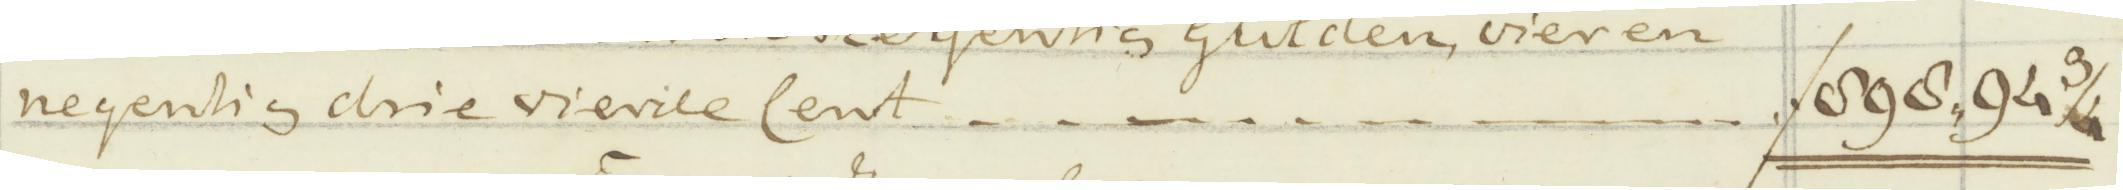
negentig drie vierde Cent- - - - - - - - - - - - - - -.ƒ 898„ 94¾
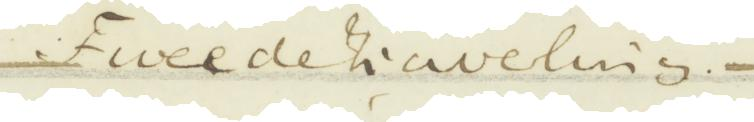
tweede kaveling.
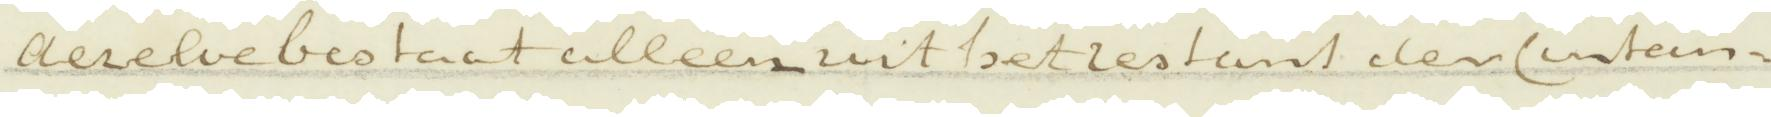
dezelve bestaat alleen uit het restant der Contan=
